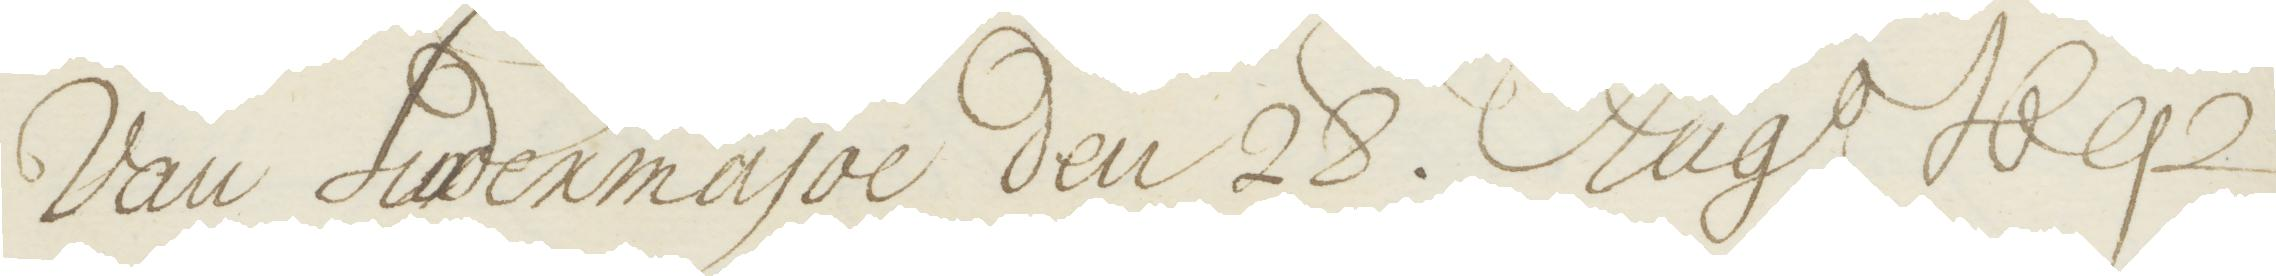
Van Sudermajoe den 28. Aug:o 1692
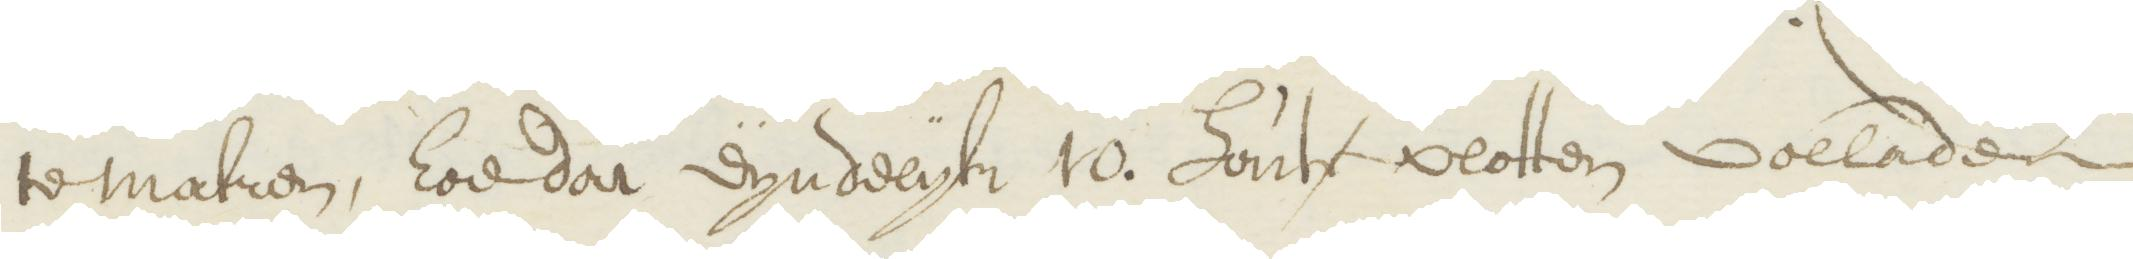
te maken, hoe dat eijndelijk 10. houte vlotten volladen
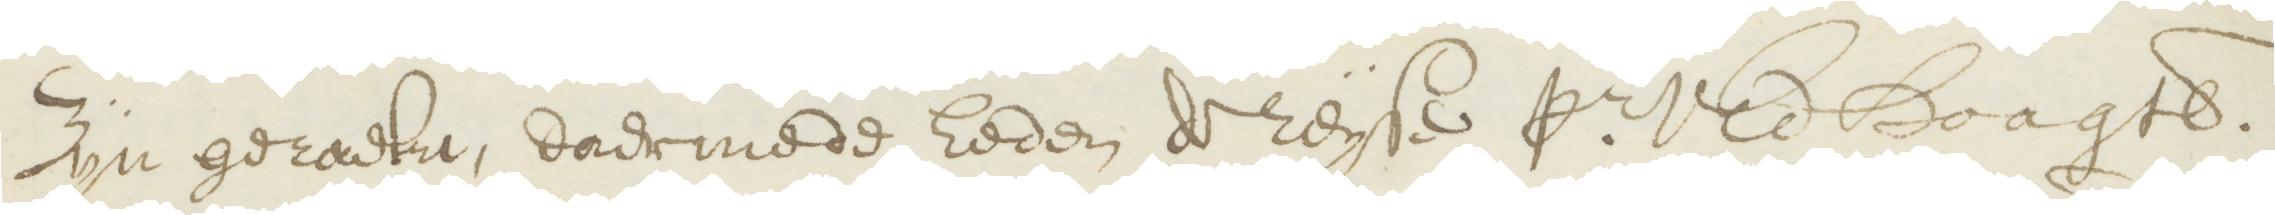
Zijn geraekt, daermede heden de reijse p:r VEd Ho agtb.
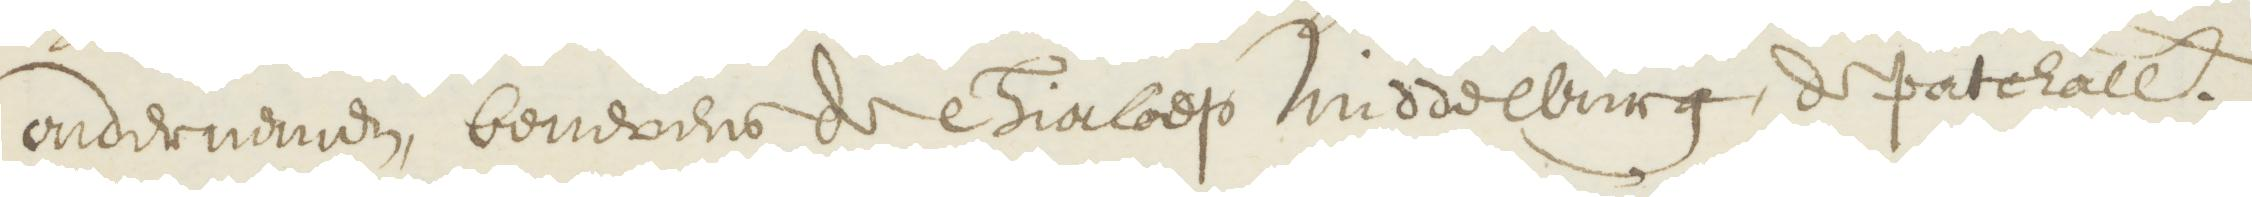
ondernemen, benevens de chialoep Middelburg, de patchall:
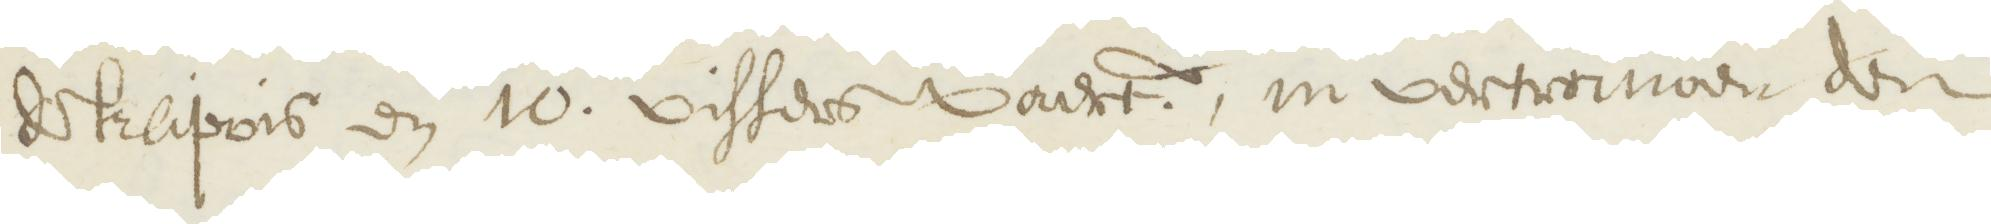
de klipvis en 10. vissers vaert., in vertrouwen den
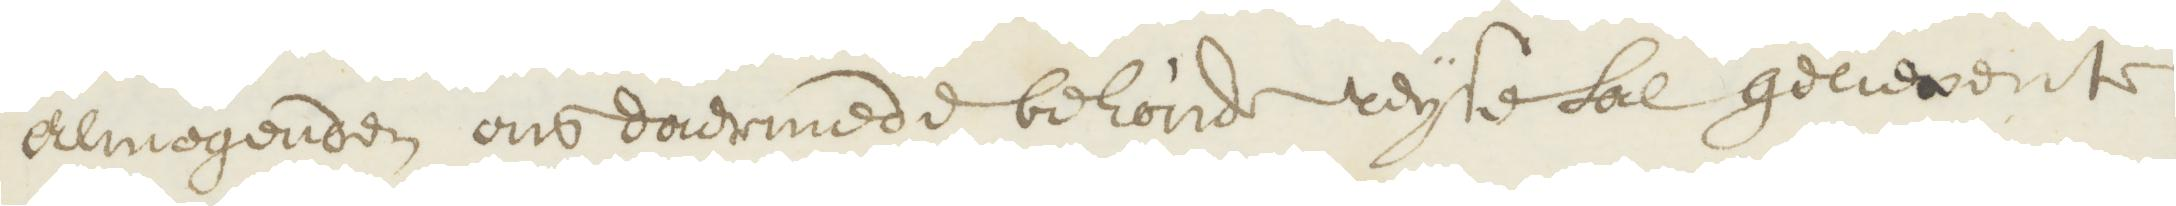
almogenden ons daermede behoude reijse Sal gelieven te
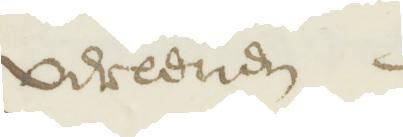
verlenen
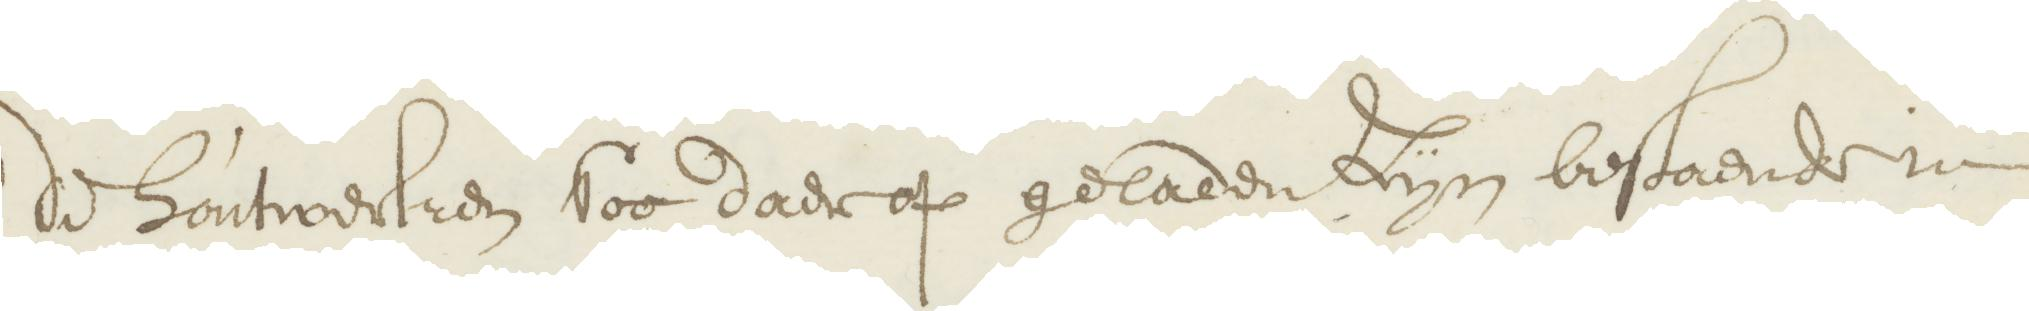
de houtwerken Soo daer op geladen Zijn bestaende in
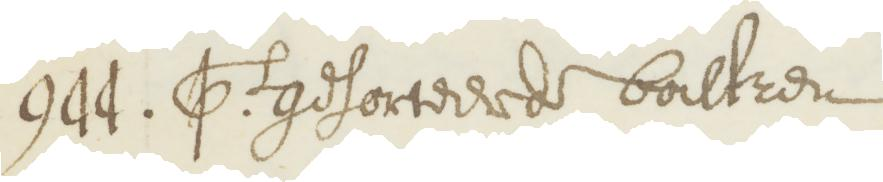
944. p.s gesorteerde balken
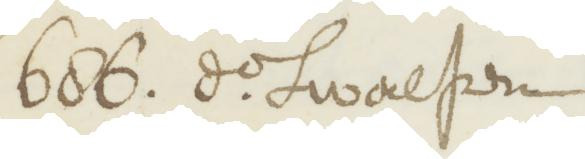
686. d.o Swalpen
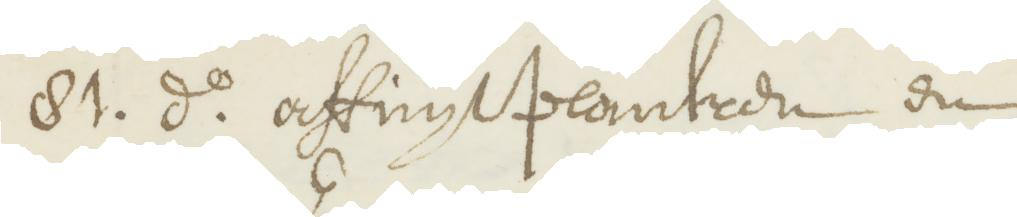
81. d.o affuijtplanken en
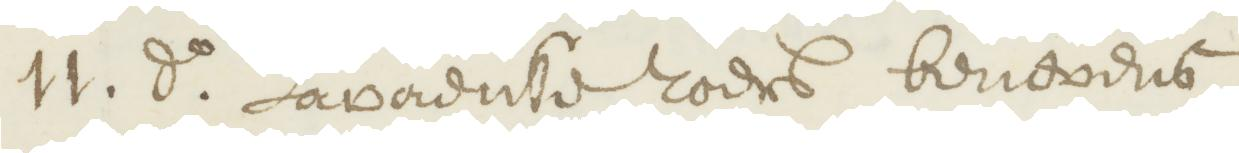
11. d.o Iavaense roers benevens
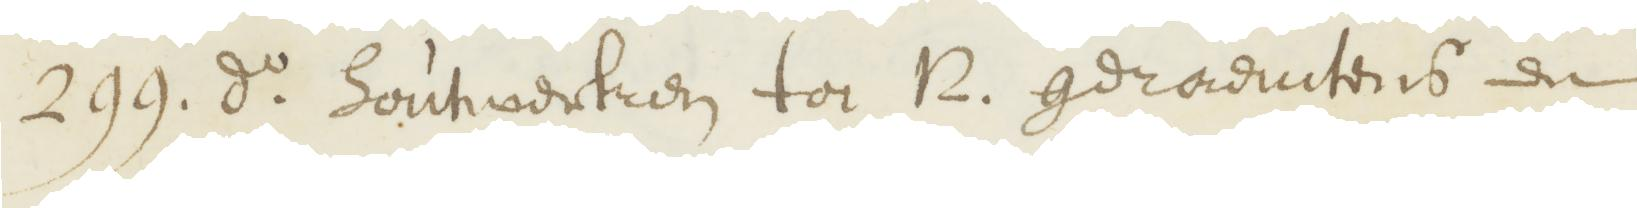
299. d.o houtwerken tot 12. geraemtens en
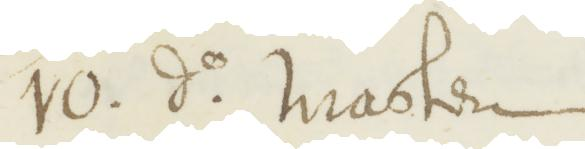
10. do masten
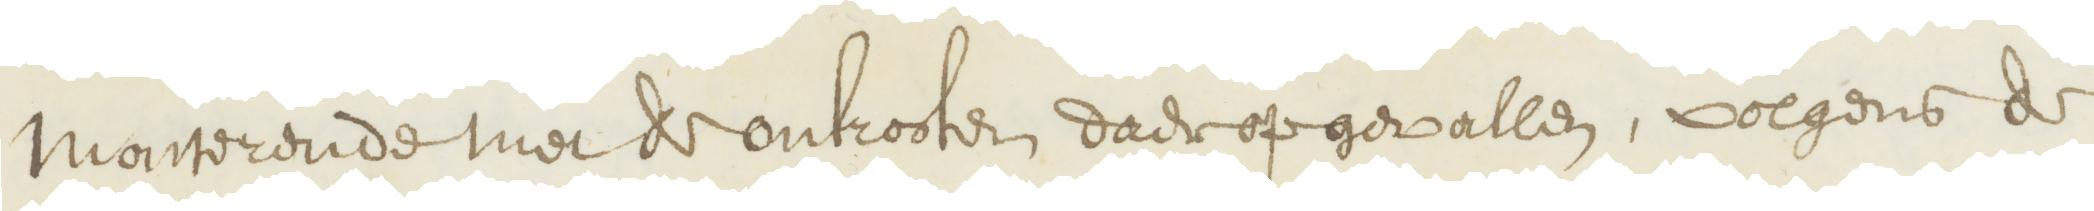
Monterende met de onkosten daerop gevallen, volgens de
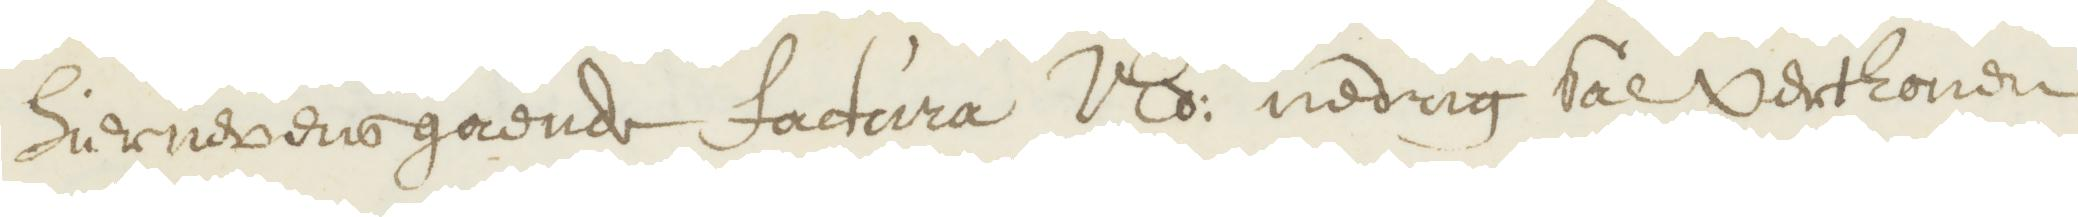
hier nevens gaende factura UEd: nedrig sal Verthonen
